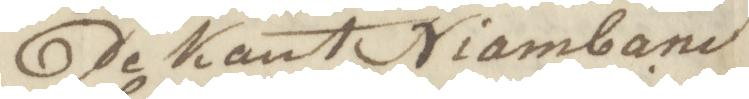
de kant Niambani
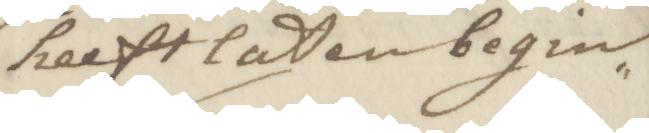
heeft laten begin„
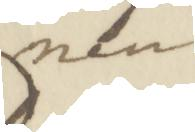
nen
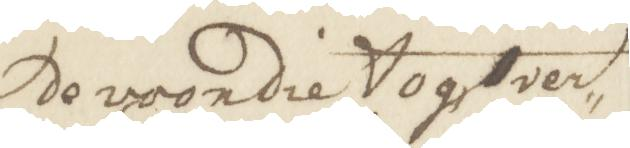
de voor die togt ver„
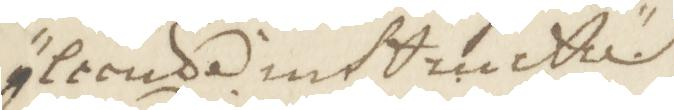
leende instructie
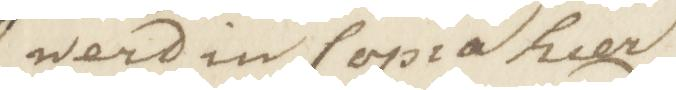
werd in Copia hier
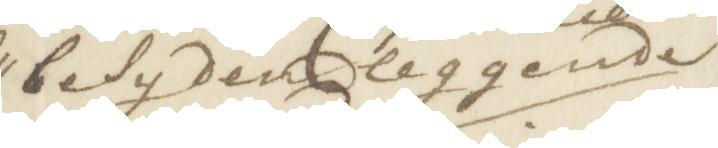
besyden leggende
